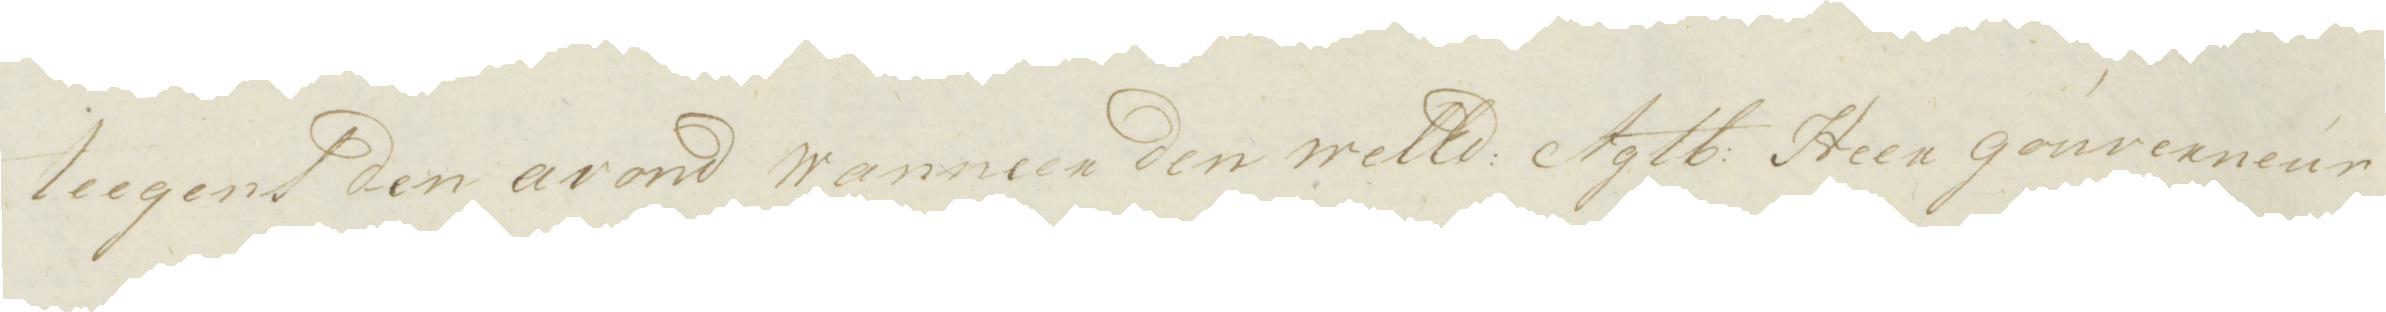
teegens den avond wanneer den wel Ed: Agtb: Heer gouverneur
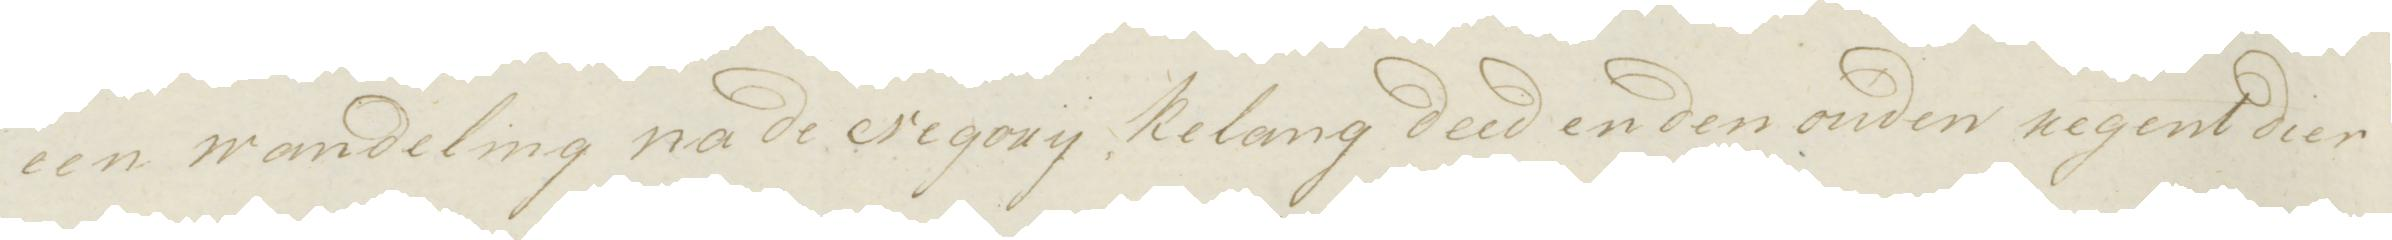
een wandeling na de Negorij kelang deed en den ouden regent dier
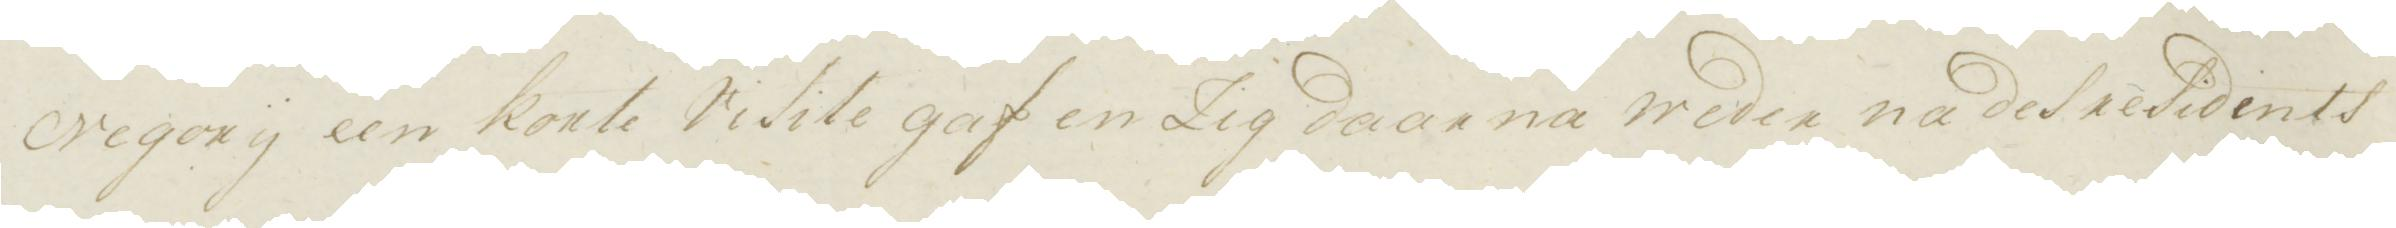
Negorij een korte visite gaf en zig daar na weder na des residents
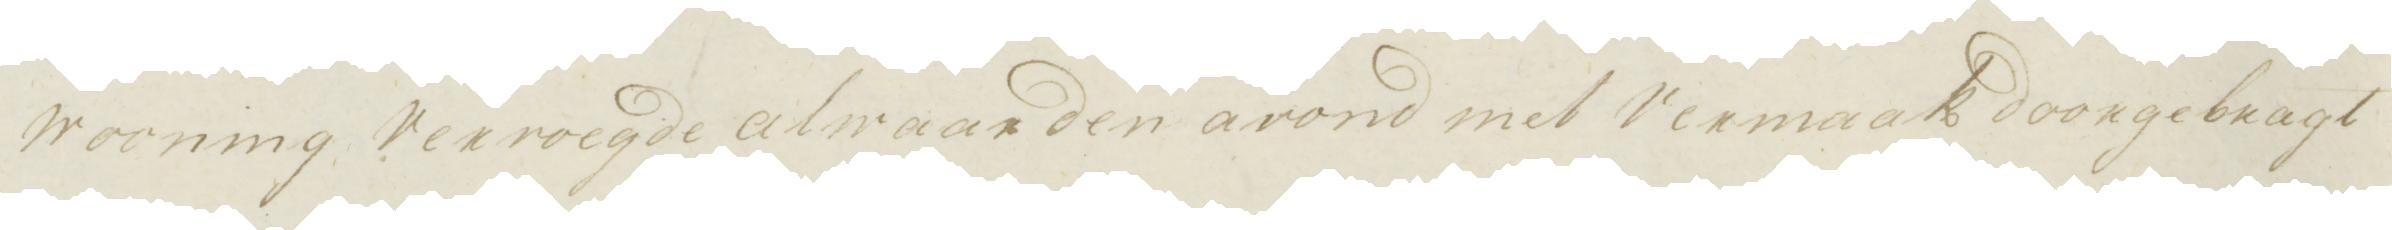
wooning vervoegde alwaar den avond met Vermaak doorgebragt
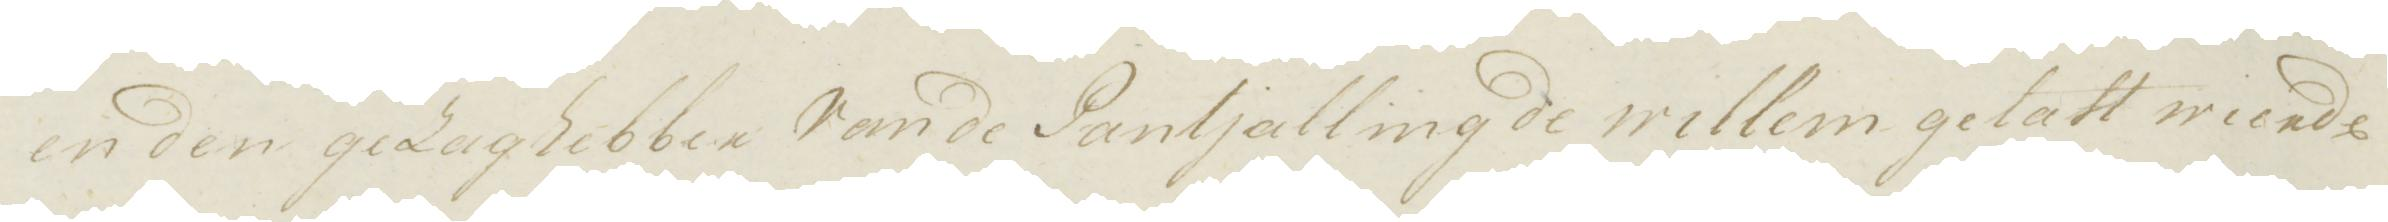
en den gezaghebber van de Pantjalling de willem gelast wierde
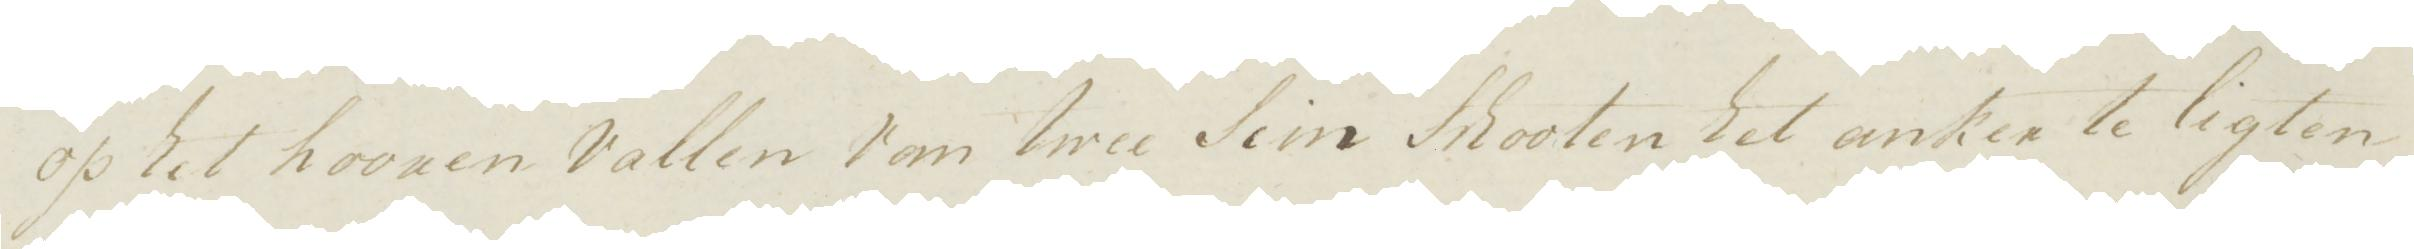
op het hooren vallen van twee sein schooten het anker te ligten
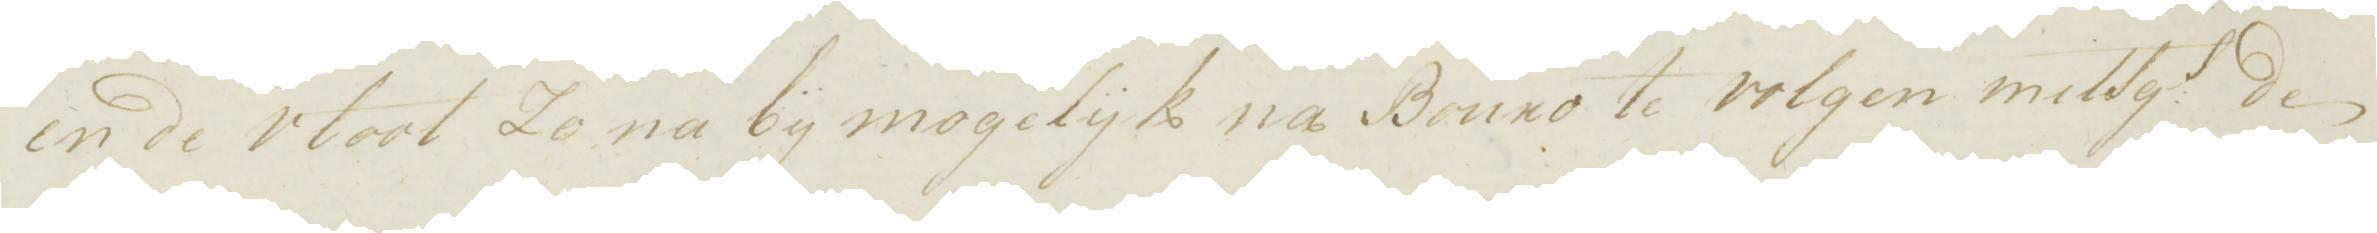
en de vloot zo na bij mogelijk na Bouro te volgen mitsg:s de
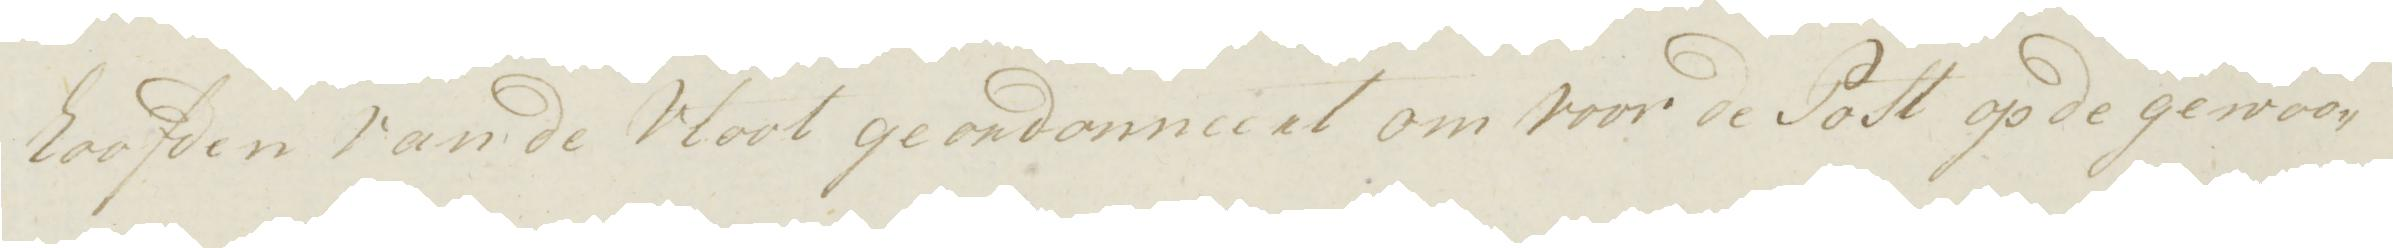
hoofden van de Vloot geordonneert om voor de Post op de gewoo
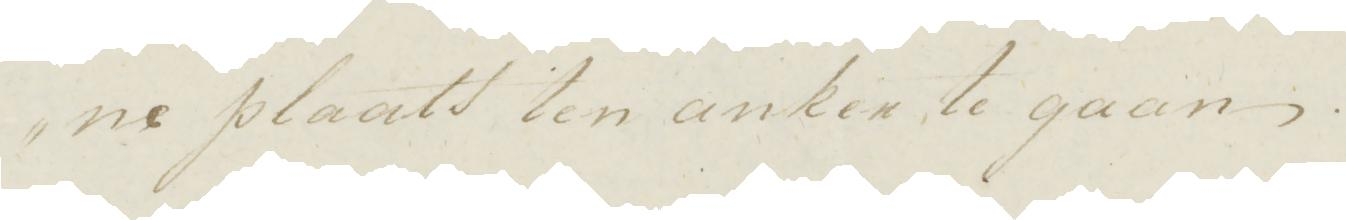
„ne plaats ten anker te gaan.
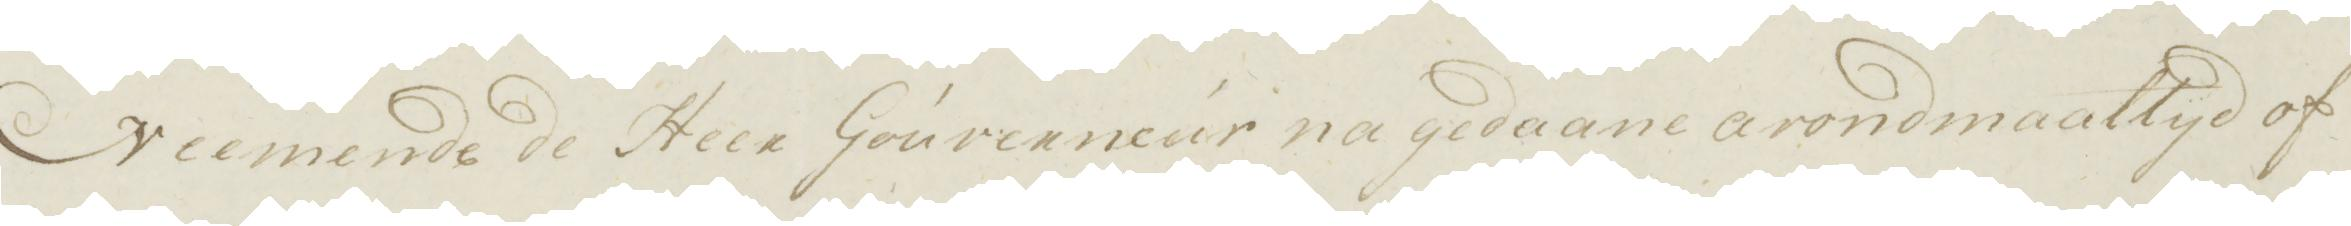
Neemende de Heer Gouverneur na gedaane avondmaaltijd of
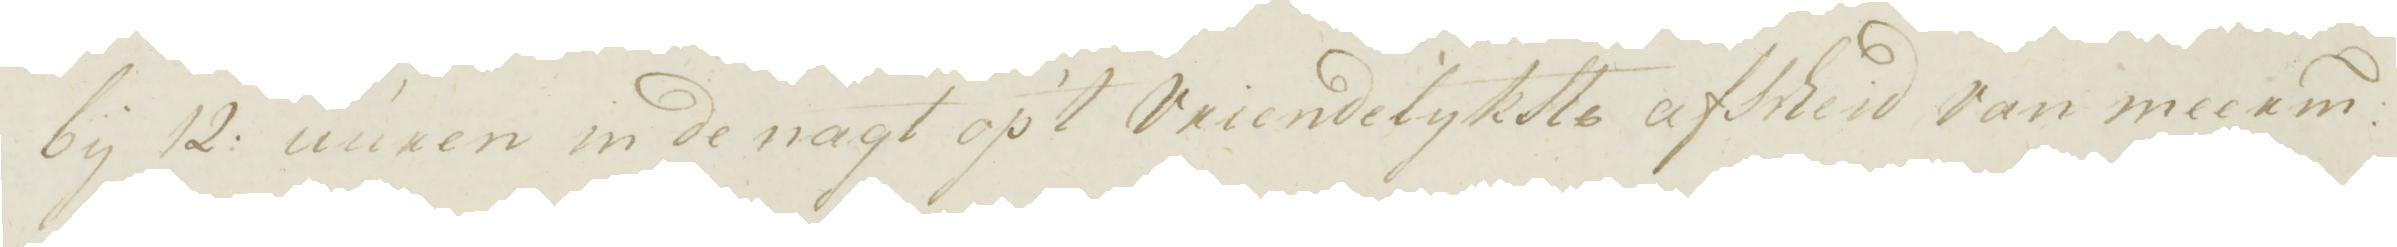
bij 12: uuren in de nagt op ’t vriendelijkste afscheid van meerm:
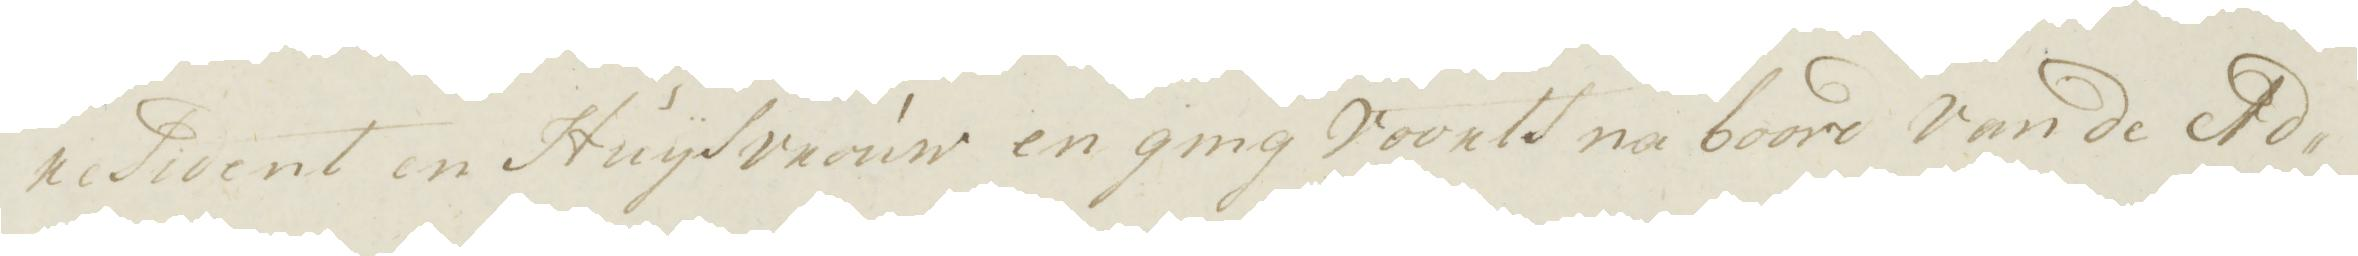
resident en Huijsvrouw en ging voorts na boord van de Ad„
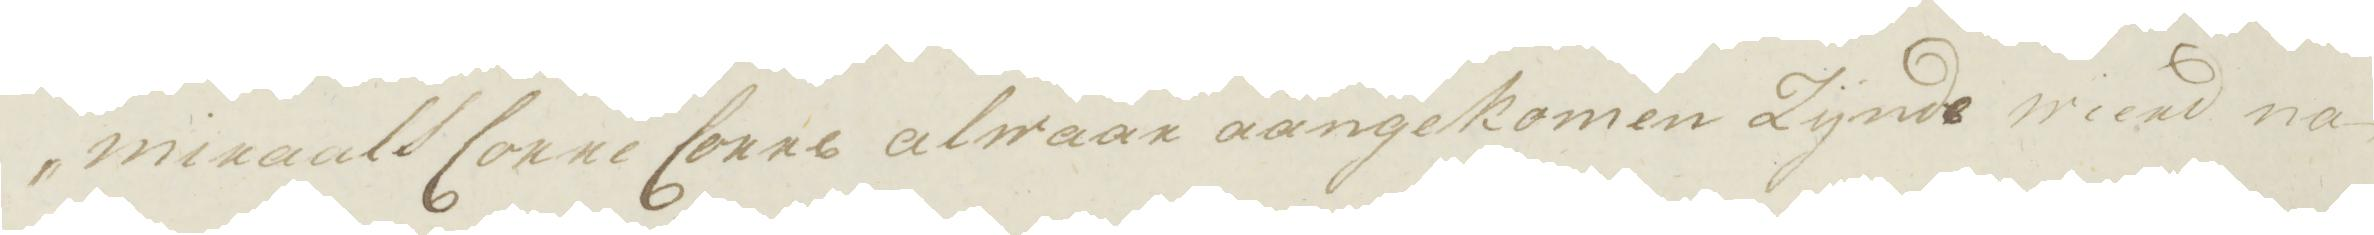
„miraals corre corre alwaar aangekomen zijnde wierd na
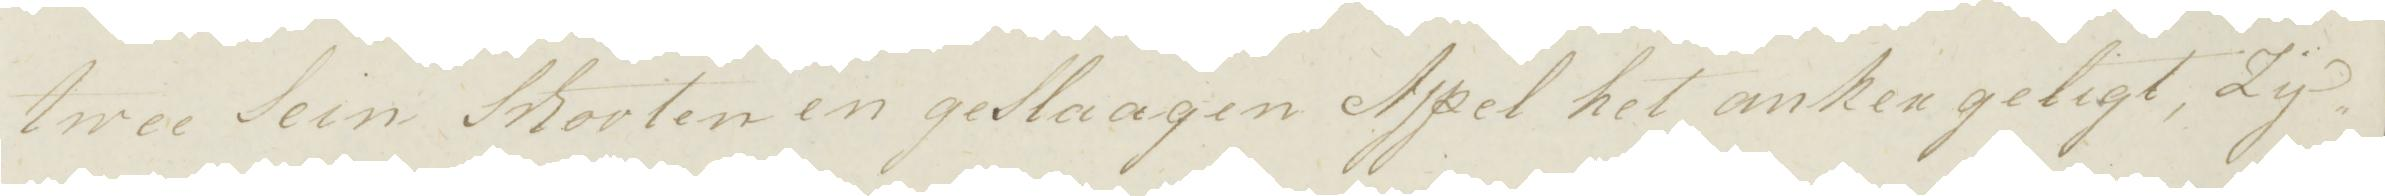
twee sein schooten en geslaagen Appel het anker geligt, zij„
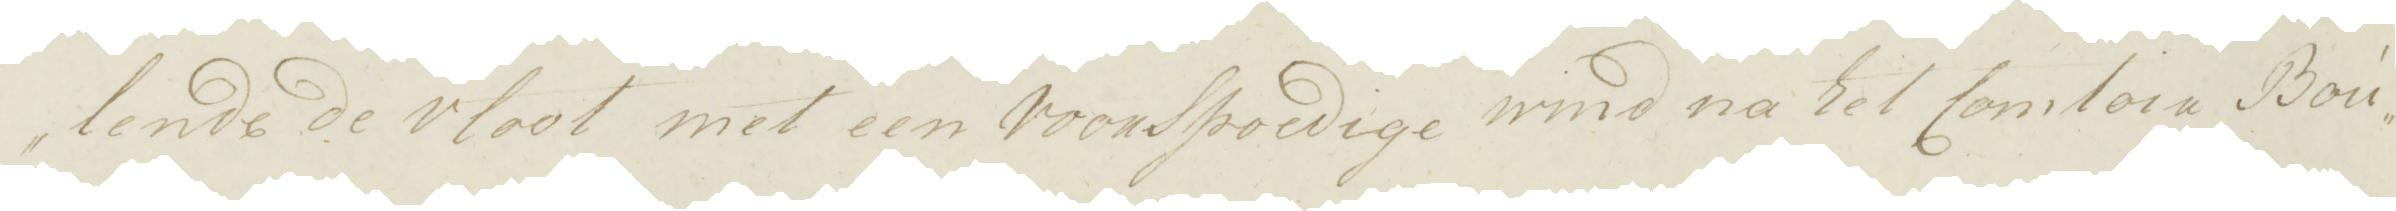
„lende de vloot met een voorspoedige wind na het comtoir Bou
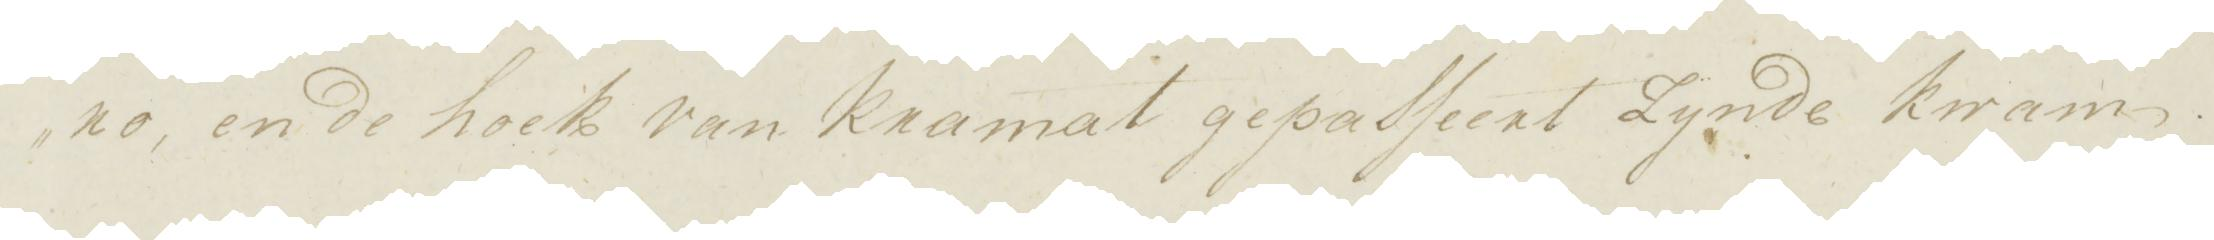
„ro, en de hoek van kramat gepasseert zijnde kwam
